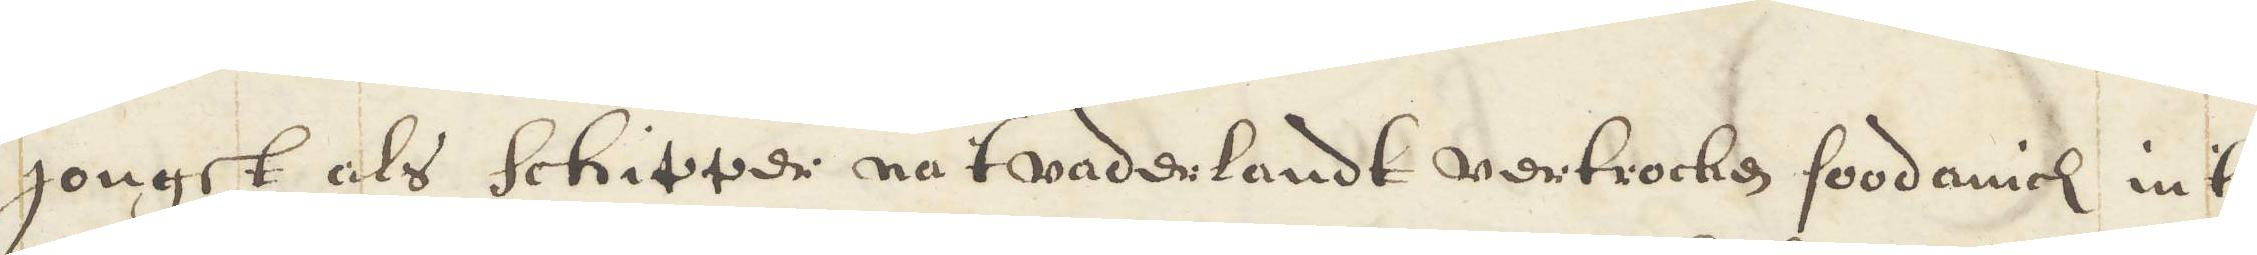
jongst als schipper na 't vaderlandt vertrocken soodanigh in ’t
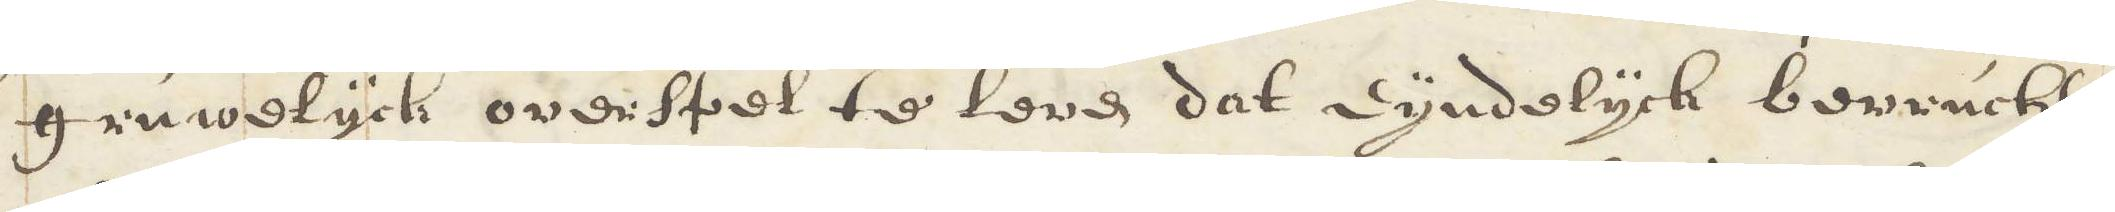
gruwelijck overspel te leven dat eijndelijck bevrucht
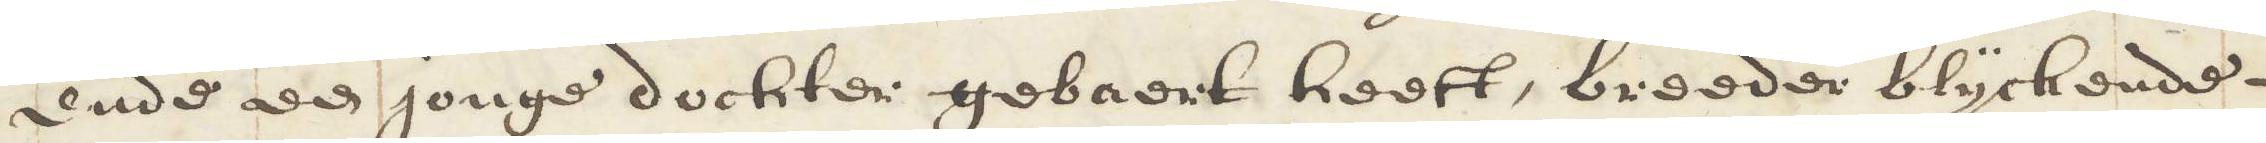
ende een jonge dochter gebaert heeft, breeder blijckende-
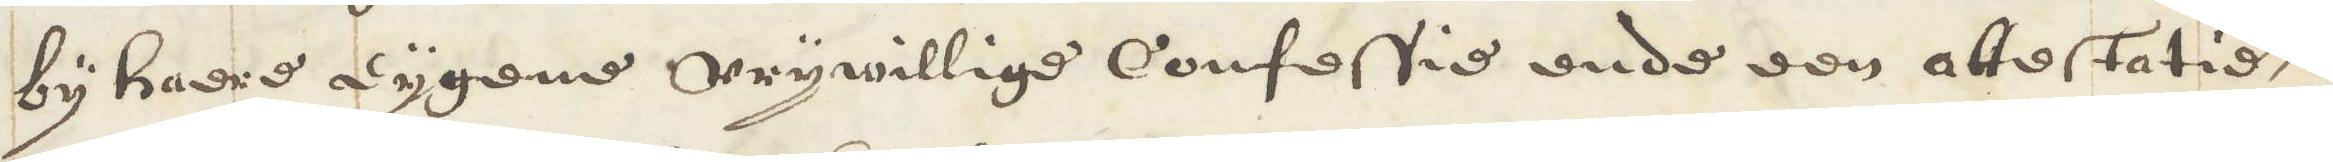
bij haere eijgene vrijwillige confessie ende een attestatie,
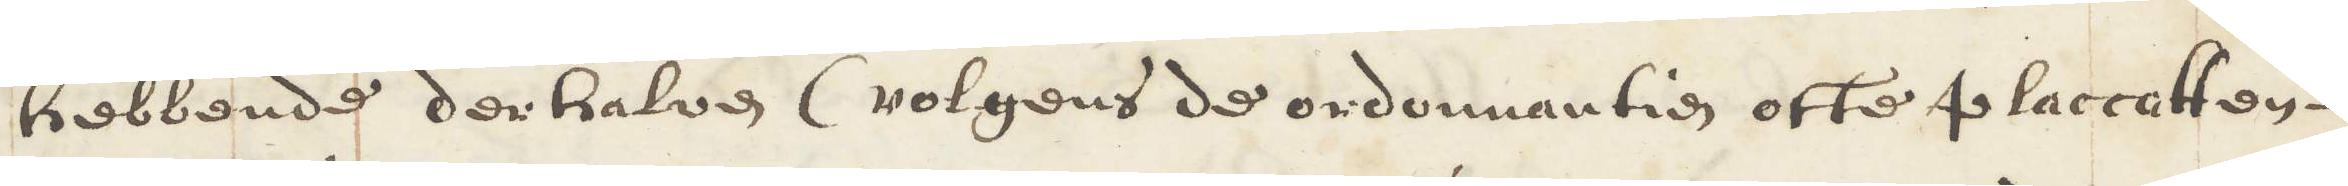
hebbende derhalven (volgens de ordonnantien ofte placcatten —
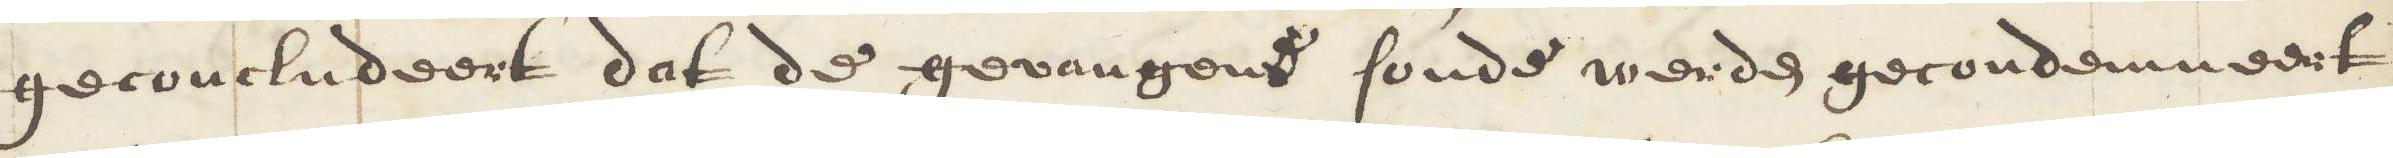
geconcludeert dat de gevangene soude werden gecondemneert
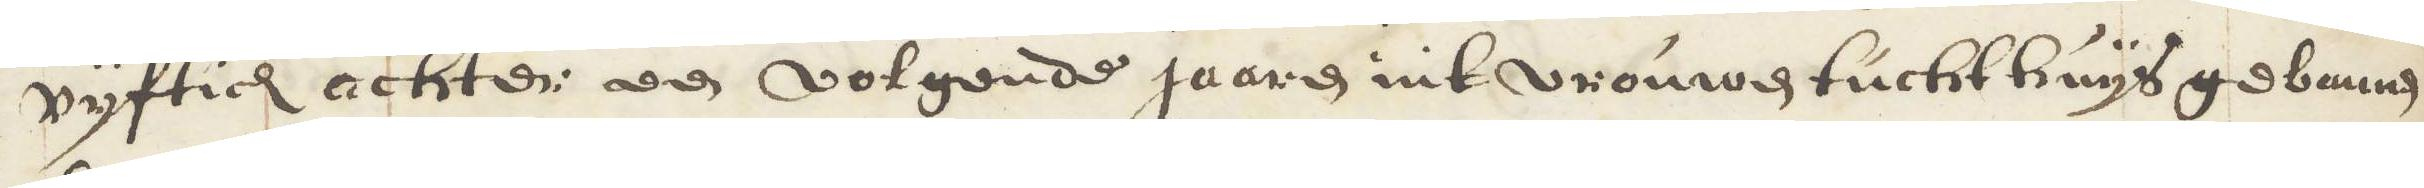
vijftich achter een volgende jaaren int vrouwen tucht huijs gebannen
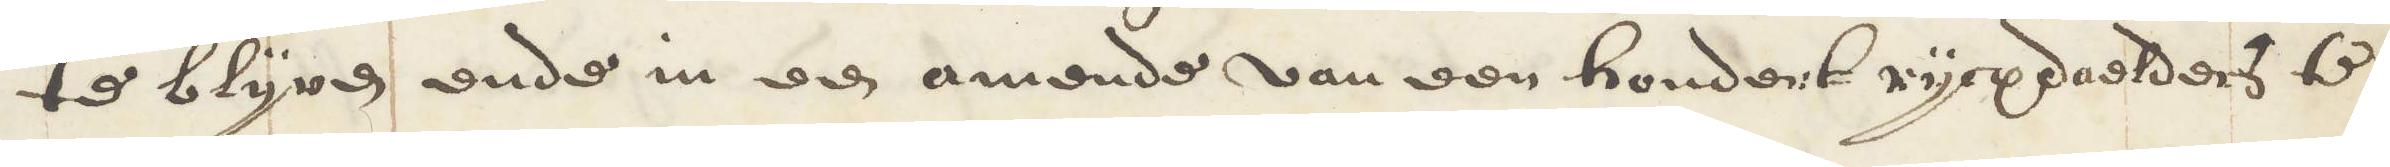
te blijven ende in een amende van een hondert rijcxdaelders te
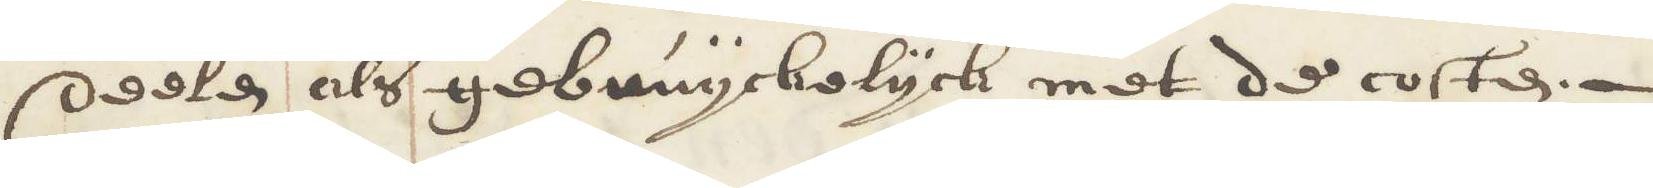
deelen als gebruijckelijck met de costen.—
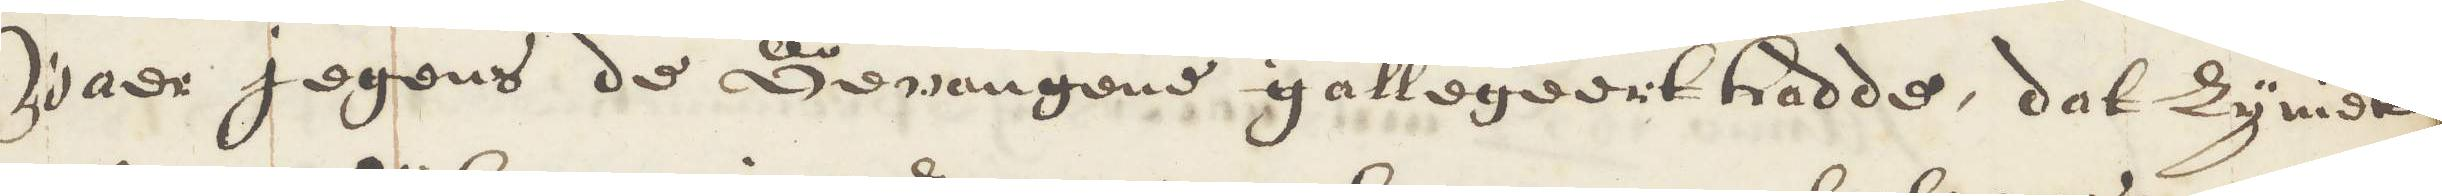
Waer jegens de Gevangene g allegeert hadde, dat zij niet
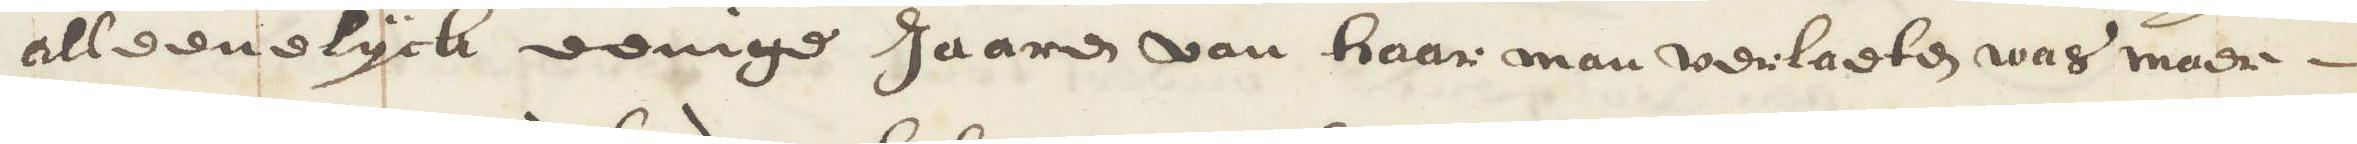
alleenelijck eenige jaaren van haar man verlaeten was maer —
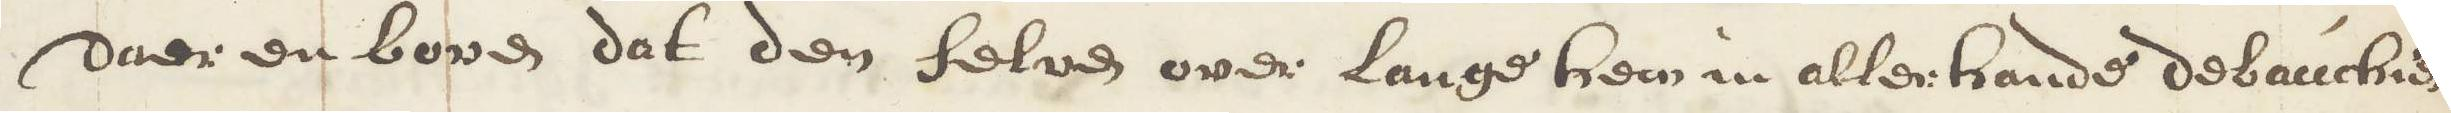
daer en boven dat den selven over lange hem in aller hande debauchien
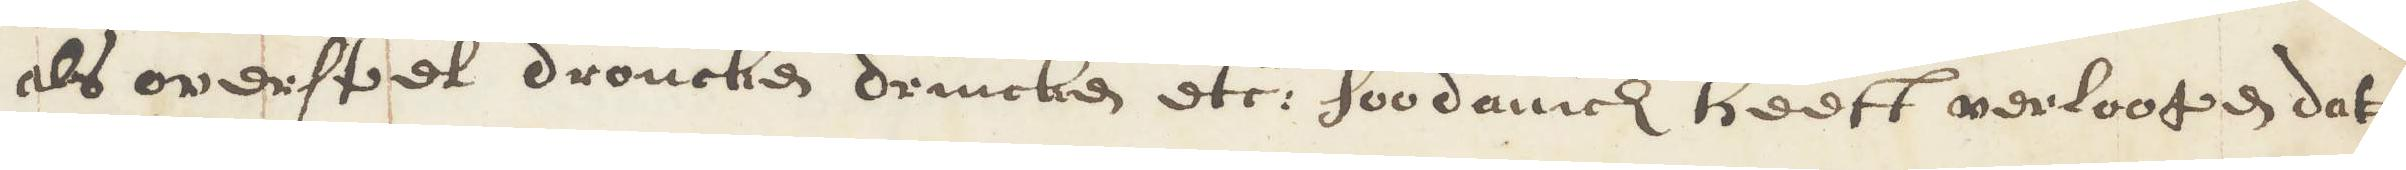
als overspel droncken drincken etc: soodanich heeft verloopen dat
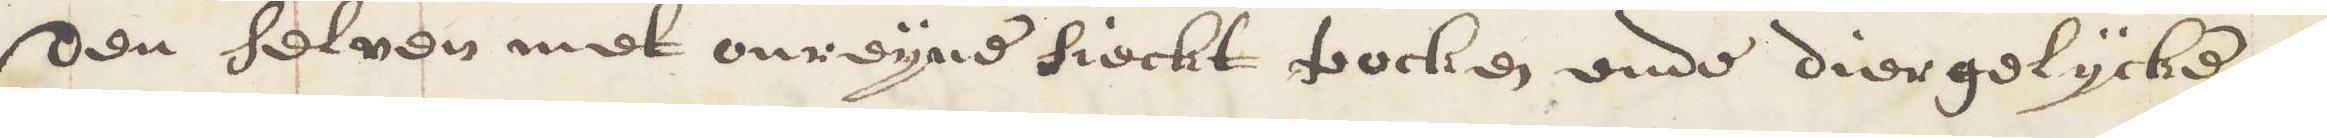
den selven met onreijne sieckt pocken ende diergelijcke —
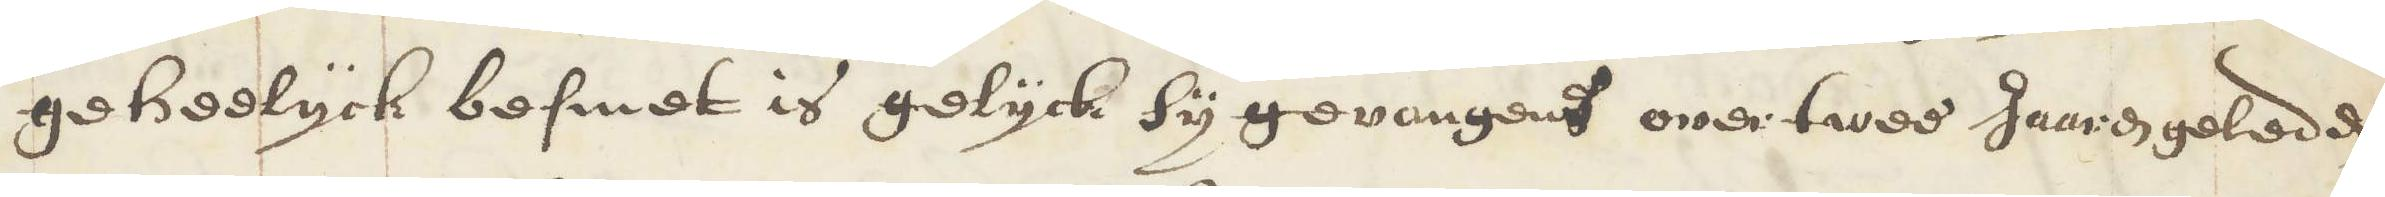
geheelijck besmet is gelijck sij gevangens over twee Jaaren geleden
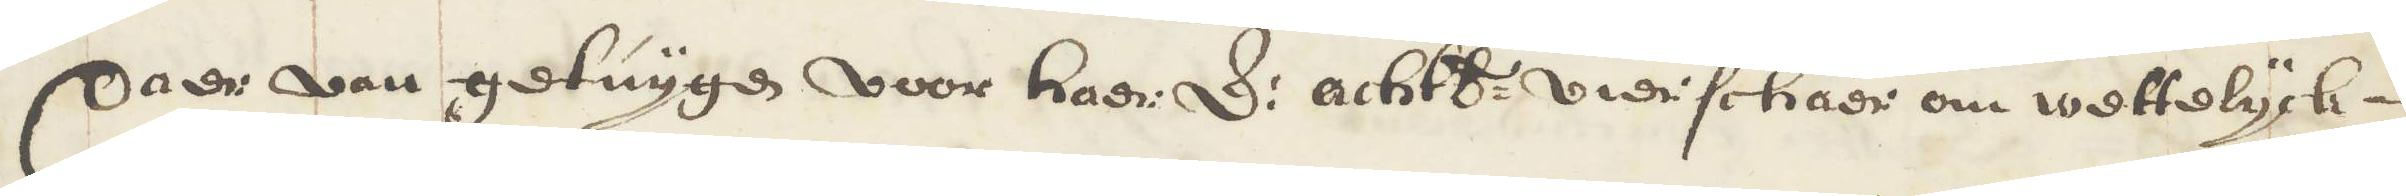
daer van getuijgen voor haer E: achtb= vierschaer om wettelijck -
